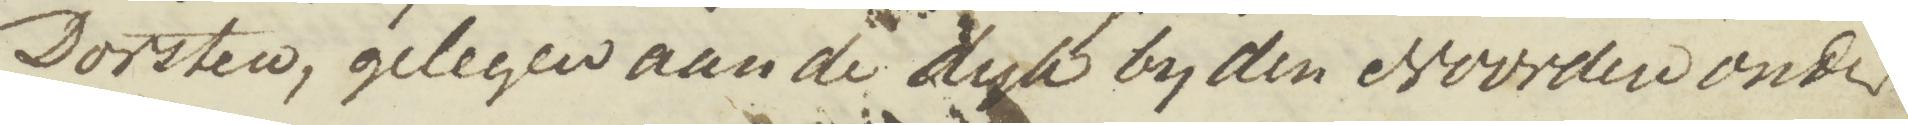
Dorsten, gelegen aan de dyk by den Noorden onder
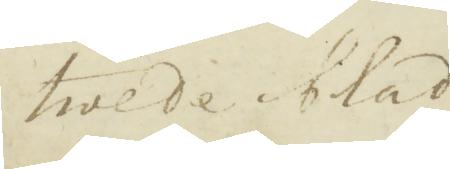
tweden blad
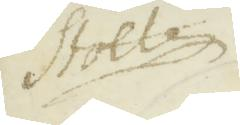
Stolte
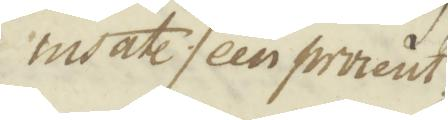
insate :/ een procent
